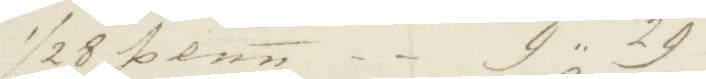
1/28 penn - - 9 „ 29
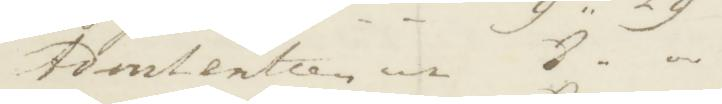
Advertentien 8 „ 00
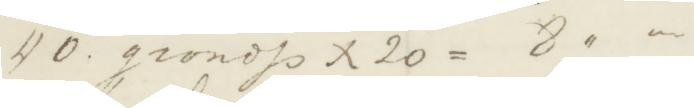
40. grondp x 20 = 8 „ 00
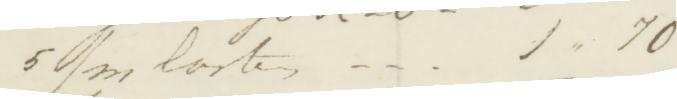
5/m lasten - - . 1 „ 70
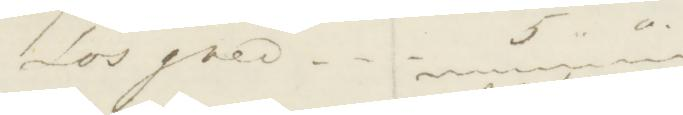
Los goed - - - 5 „ 0.
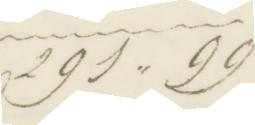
291 „ 99
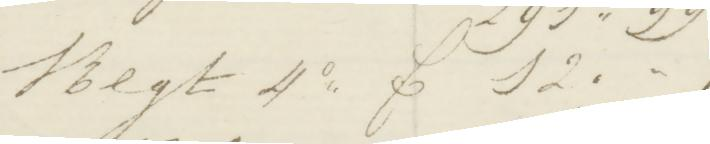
Regt 4„o ƒ 12, -
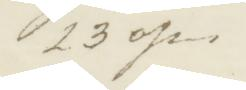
23 op.
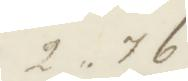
2 „ 76
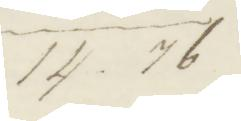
14. 76
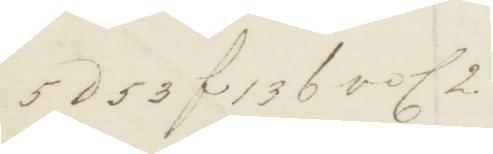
5 d 53 f 136 vo C 2.
